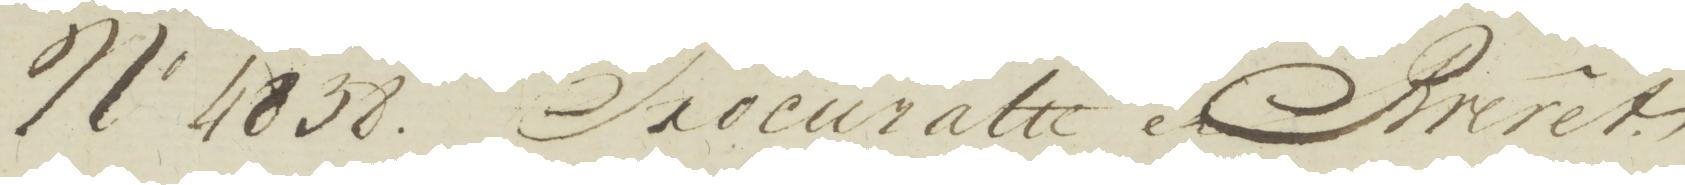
No 4838. Procuratie en Brevêt
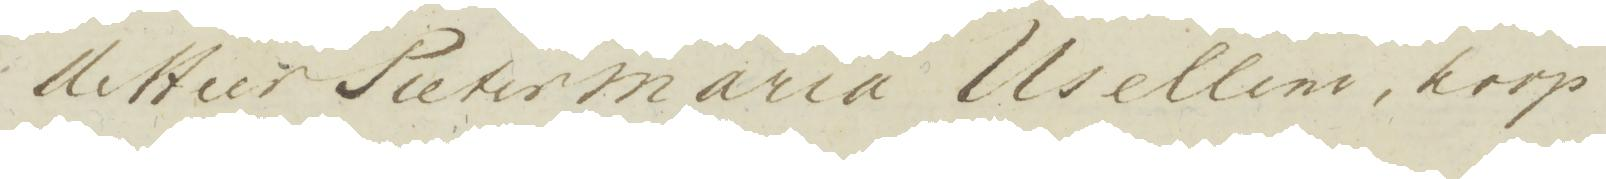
de Heer Pietermaria Usellem, koop
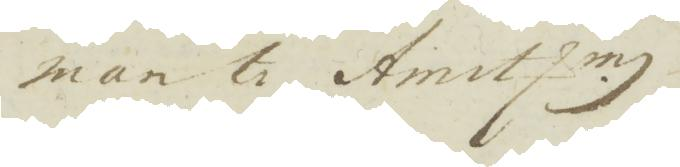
man te Amst/m
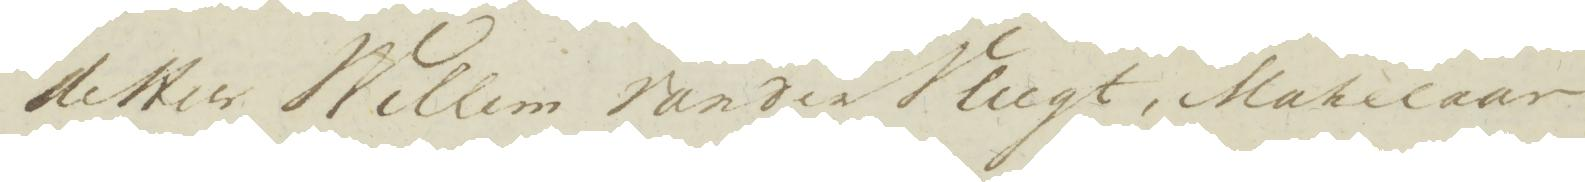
de Heer Willem van den Vlugt, Makelaar.
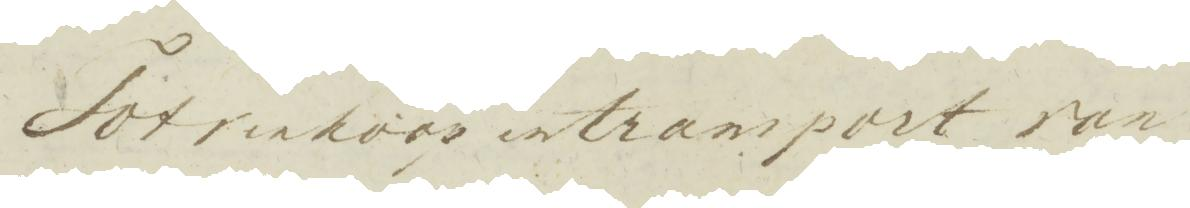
Tot verkoop en transport van
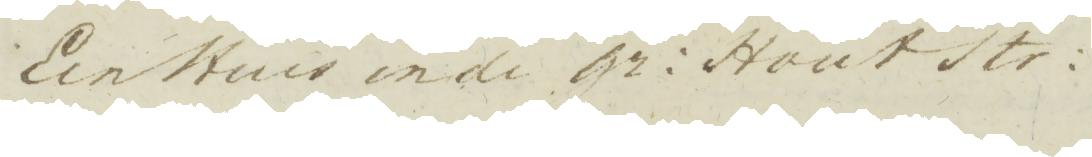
Een Huis in de gr: Houtstr:
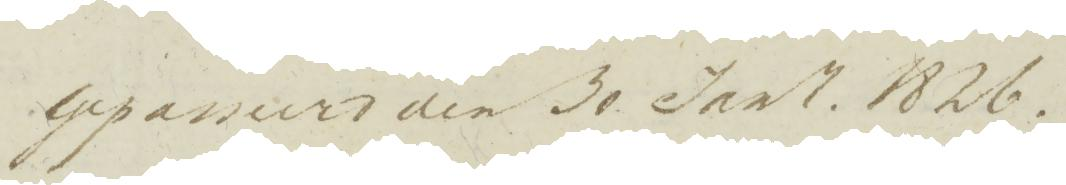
Gepasseerd den 30. Jaar. 1826.
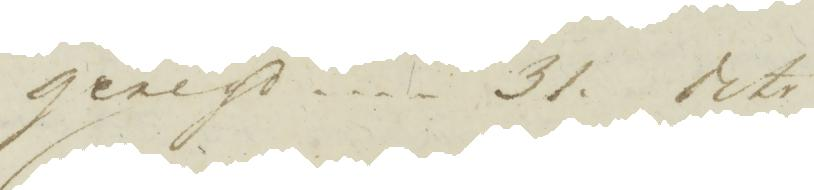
geregd - - - - 31. rtr
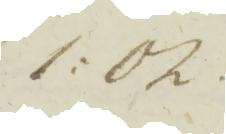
ƒ1: 02.
